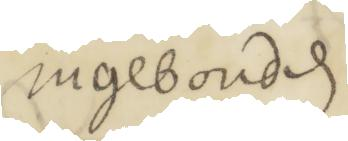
in gebonden
